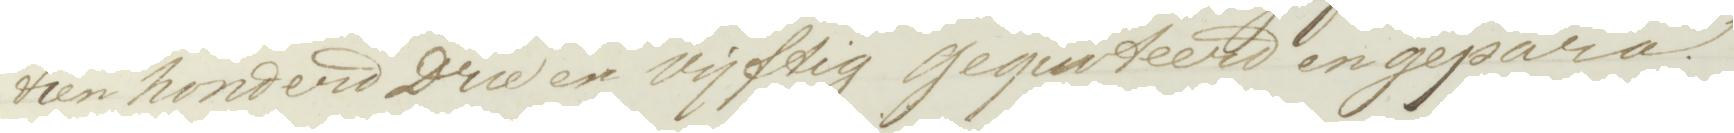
tien honderd Drie en vijftig gequoteerd en gepara.
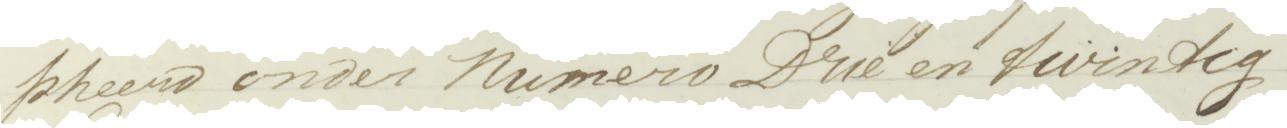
pheerd onder Numero Drie en twintig
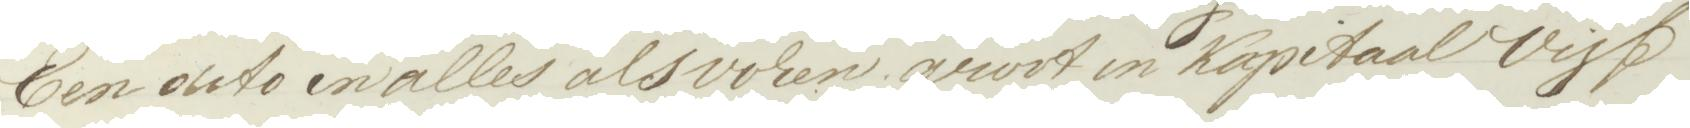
Een dito in alles als voren groot in kapitaal vijf
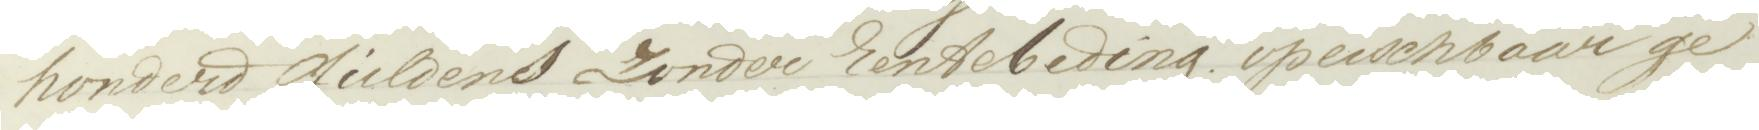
honderd guldens zonder Rentebeding. op eischbaar ge
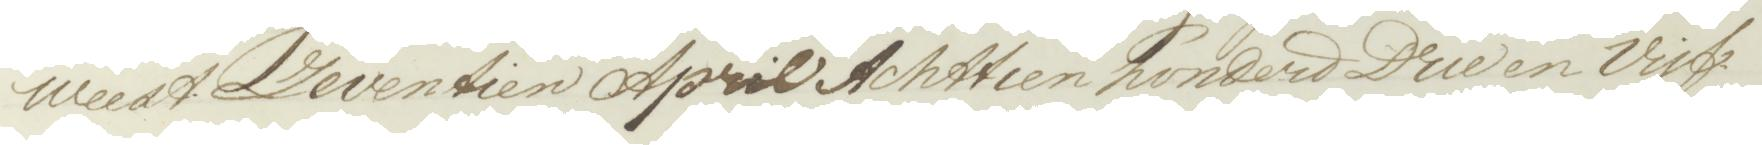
weest Zeventien April Achttien honderd Drie en Vijf
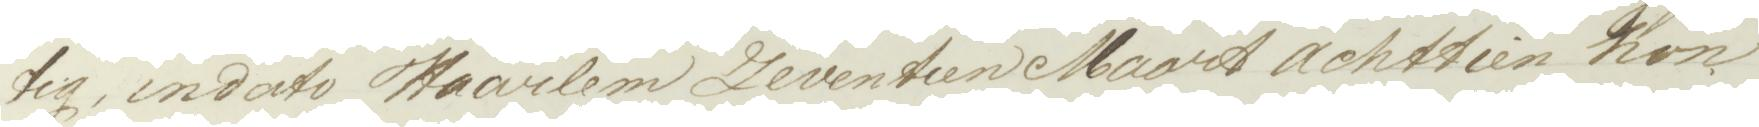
tig, in dato Haarlem Zeventien Maart achttien hon
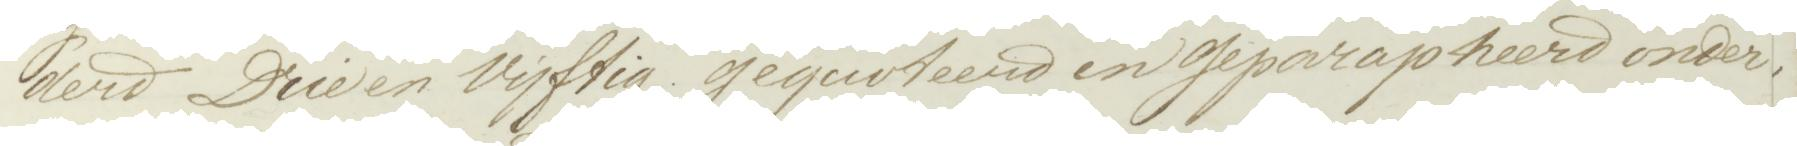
derd Drie en vijftig. gequoteerd en geparapheerd onder
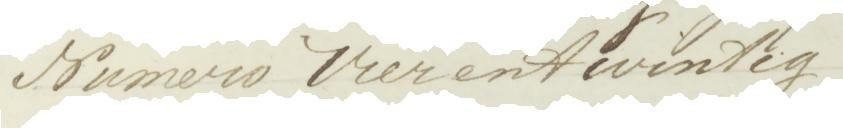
Numero vier en twintig
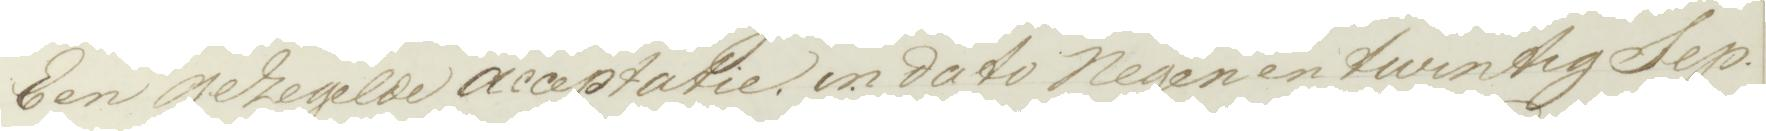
Een gezegelde acceptatie in dato Negen en twintig Sep.
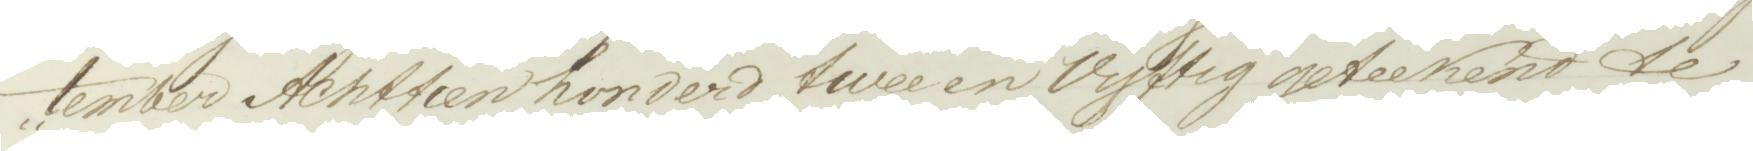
„tember Achttien honderd twee en Vyftig geteekend te
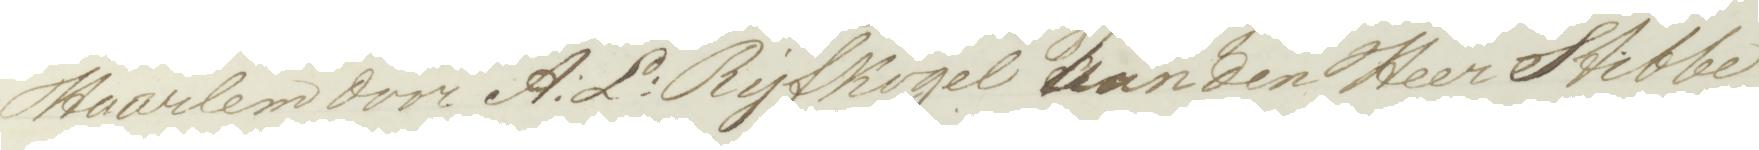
Haarlem door A: L: Rijfkogel aan den Heer Stibbe
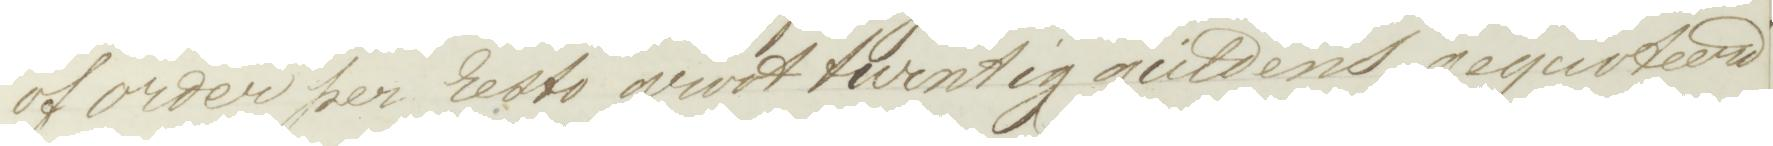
of order per resto groot twintig guldens gequoteerd
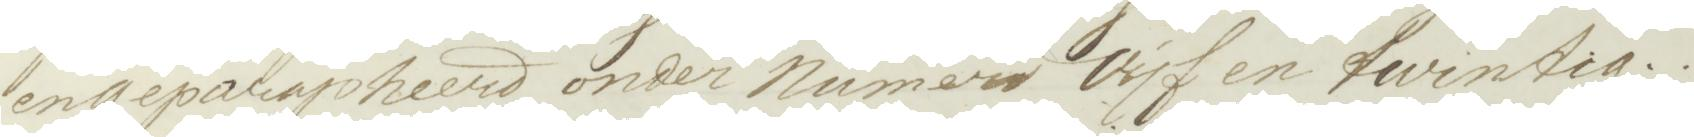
en geparapheerd onder numero vijf en twintig.
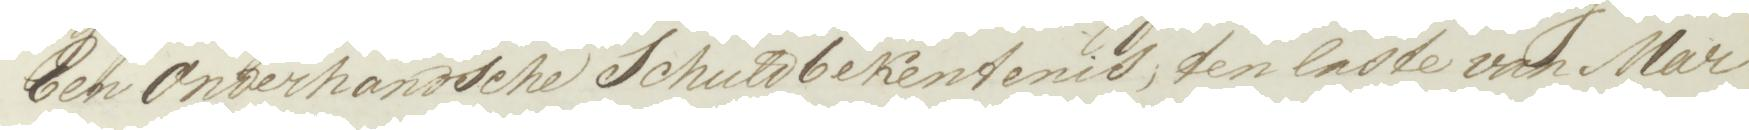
Een Onderhandsche Schuldbekentenis; ten laste van Mar
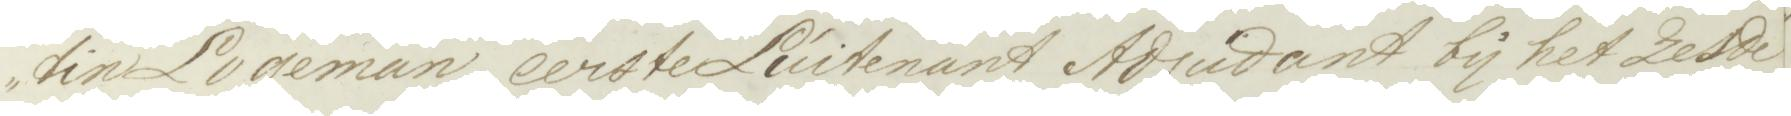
„tin Logeman, eerste Luitenant Adjudant bij het zesde
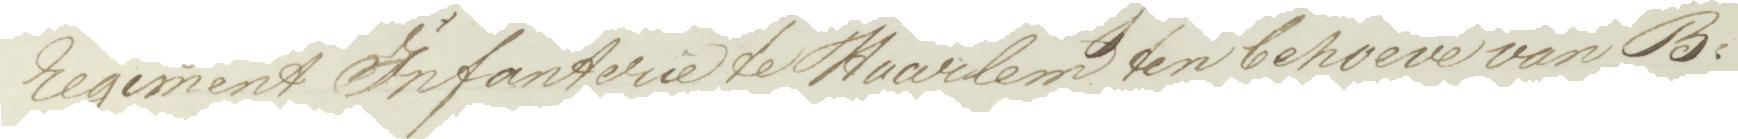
regiment Infanterie te Haarlem ten behoeve van B:
